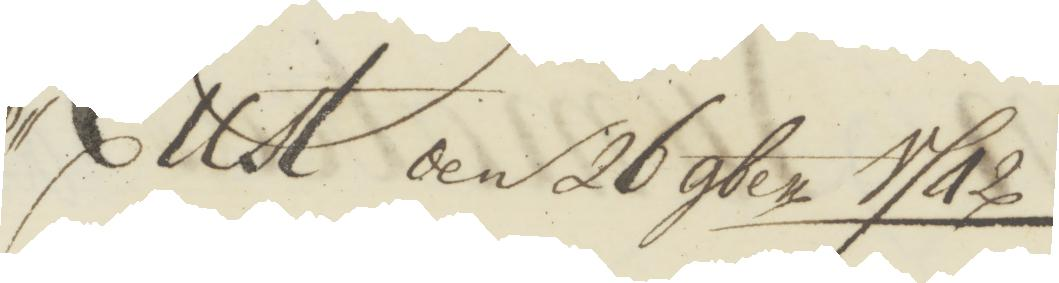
W„t Cust den 26 9ber 1742
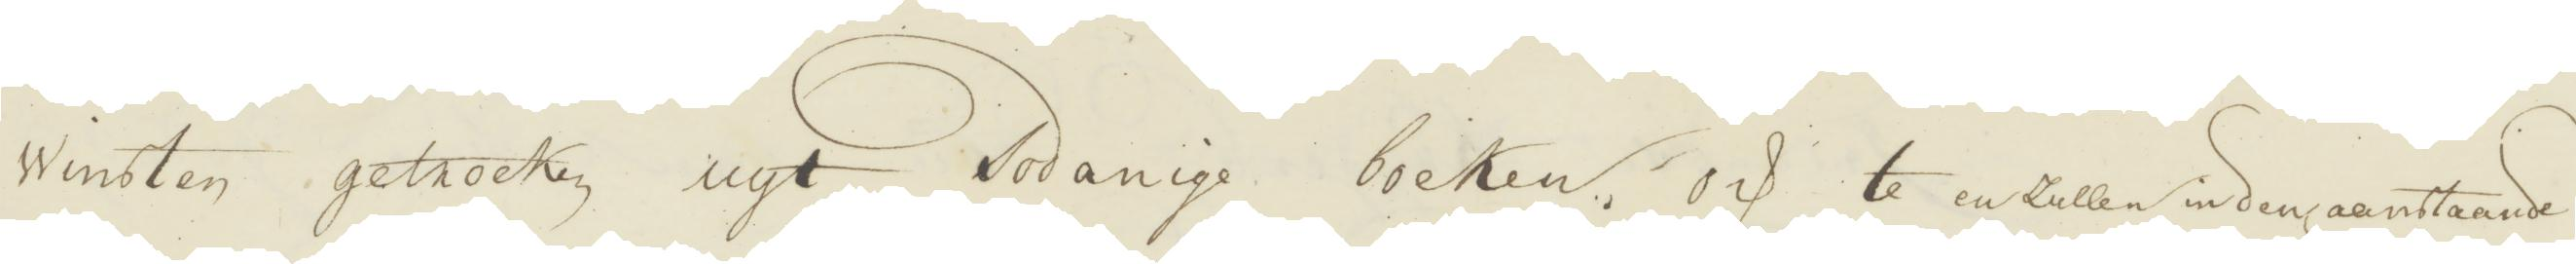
winsten getrocken uyt sodanige boeken, over te en zullen in den aanstaande
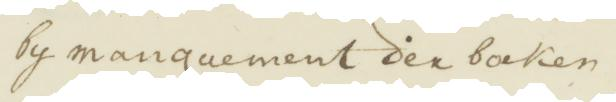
by manquement der boeken
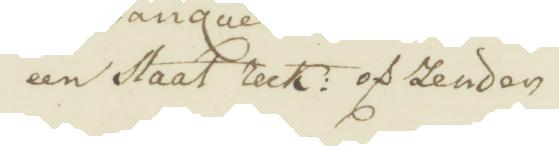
een staat reck: over zenden
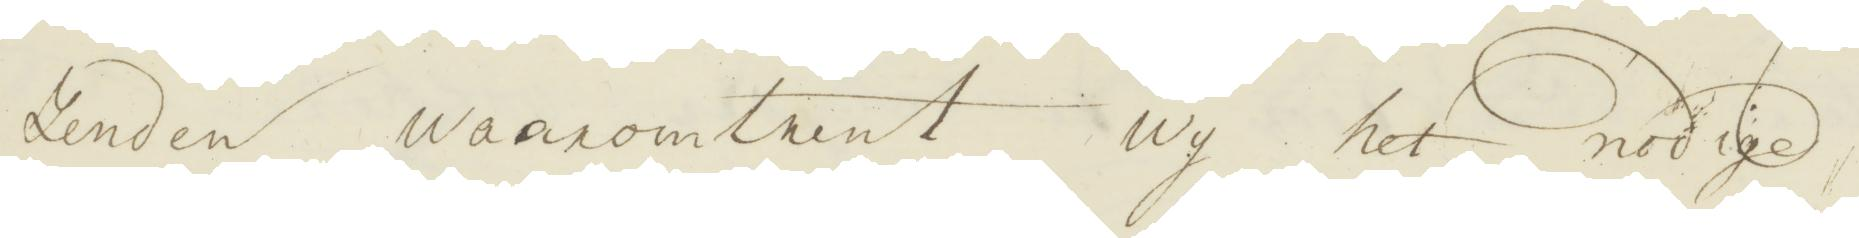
zenden waaromtrent wy het nodige
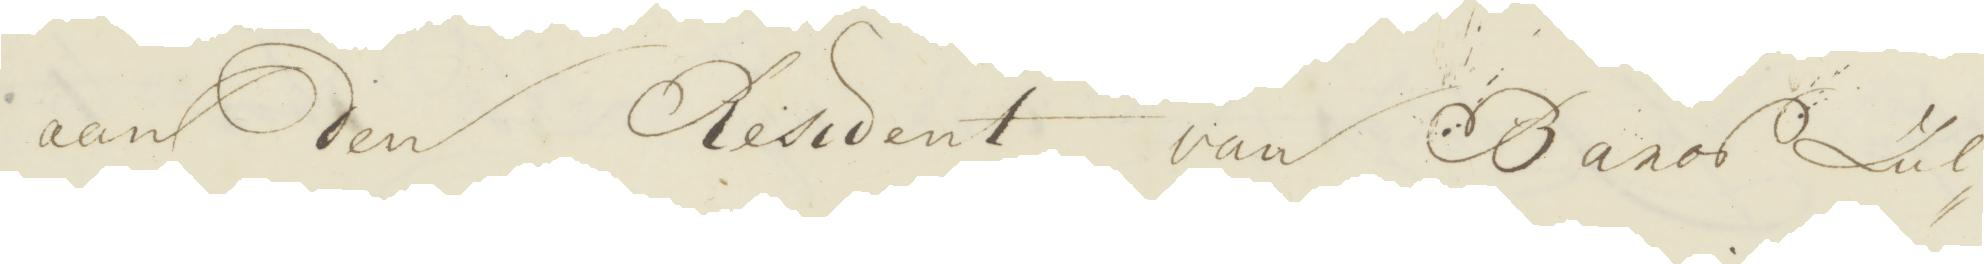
aan den Resident van Baros Zul„
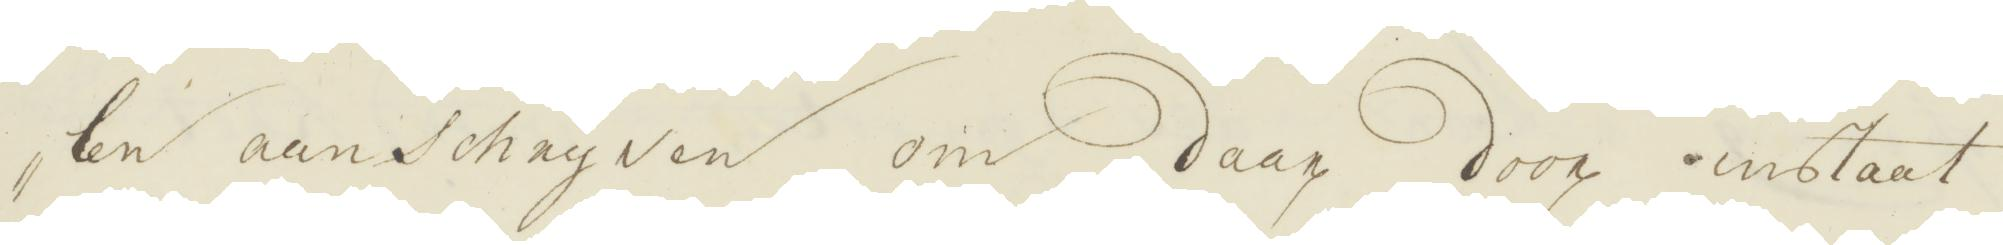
„len aanschryven om daar door instaat
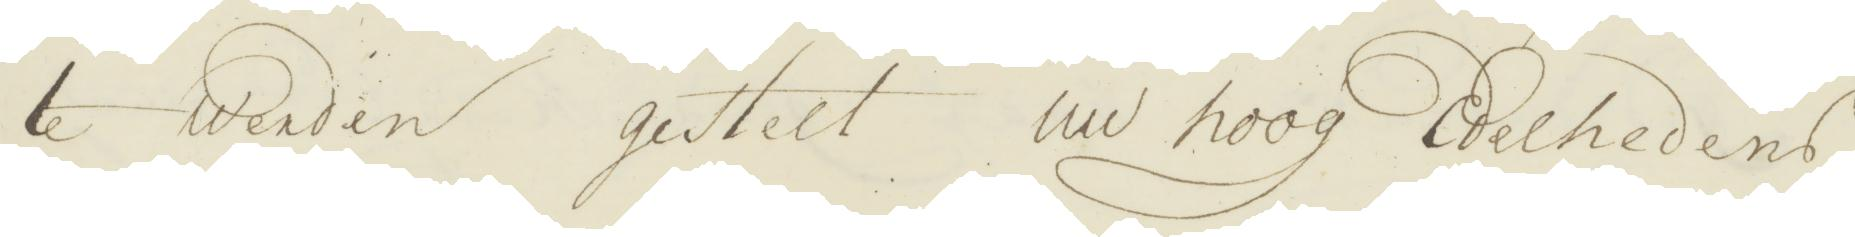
te werden gestelt uw hoog Edelhedens
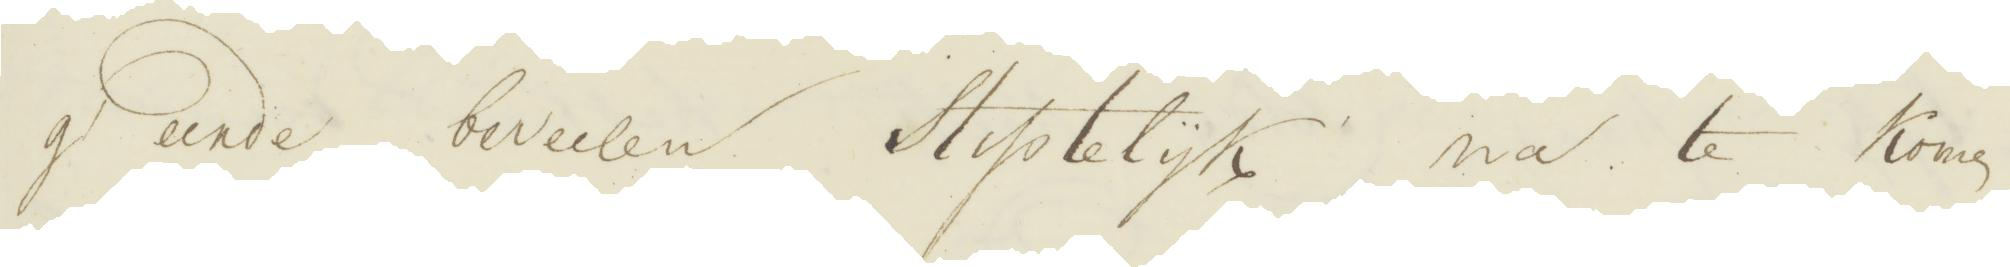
g' eerde beveelen stiptelijk na te komen
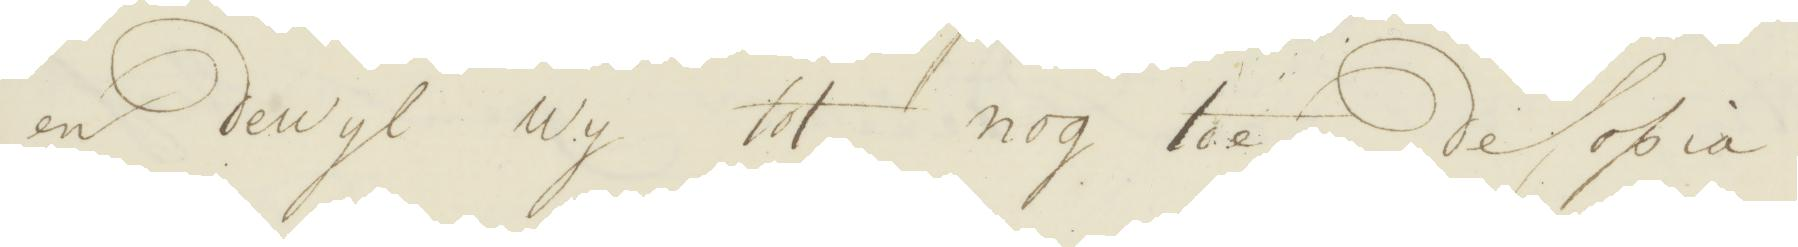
en dewyl wy tot nog toe de opia
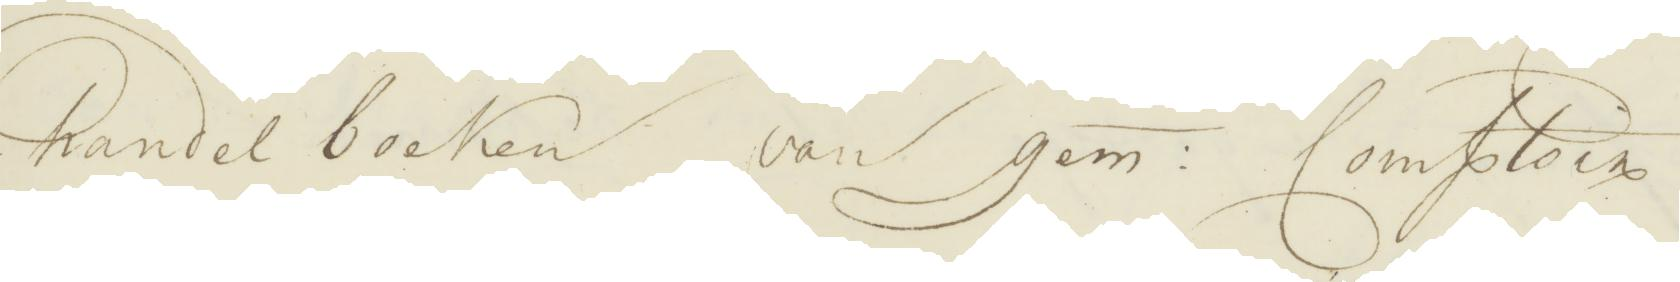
handel boeken van gem: Comptoir
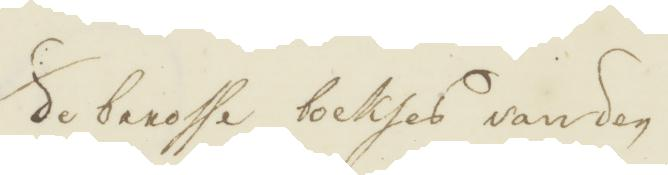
de barosse boekjes van den
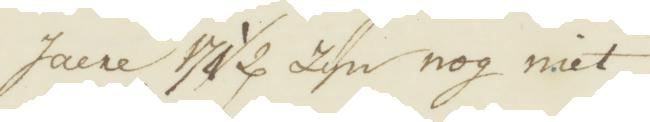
Jaere 1742 zyn nog niet
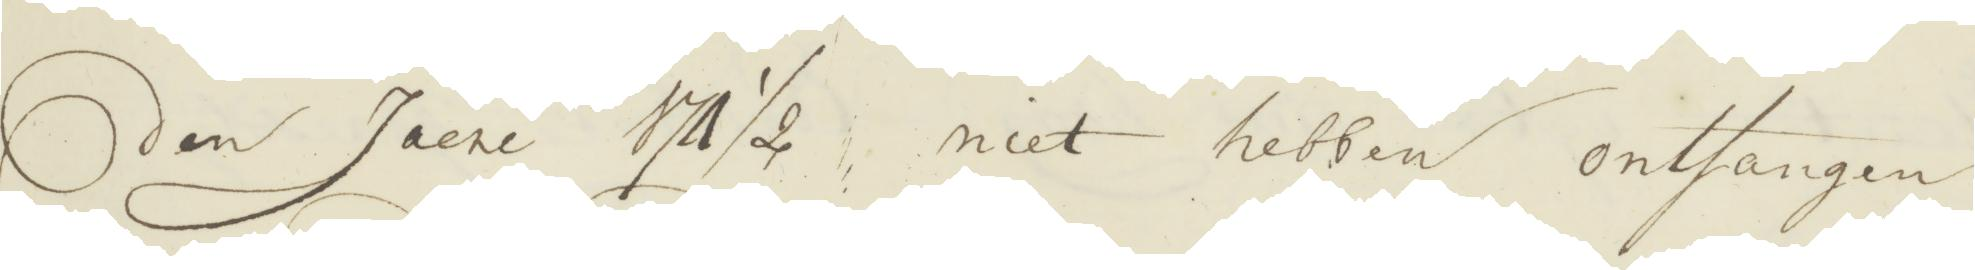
den Jaere 174½ niet hebben ontfangen
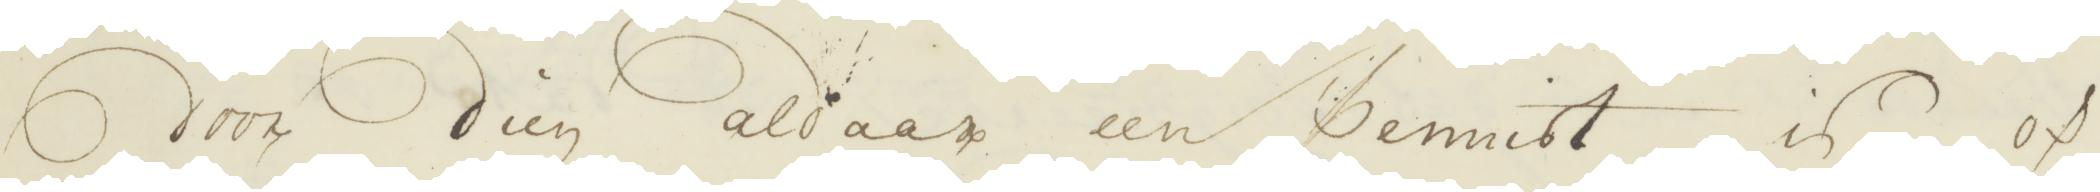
door dien aldaar een pennist is over
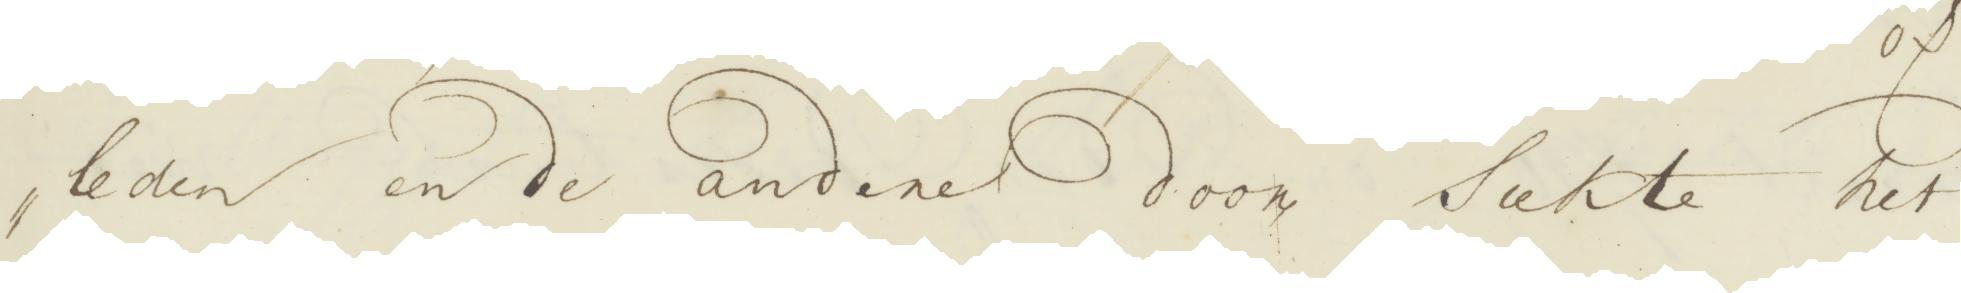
„leden en de andere door siekte het
